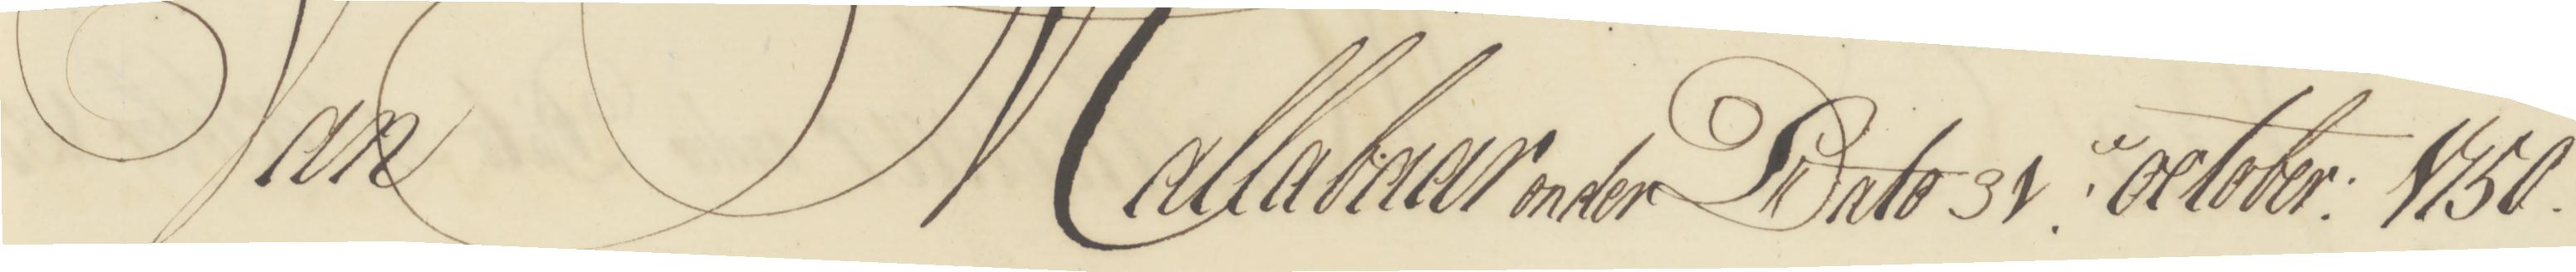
Van Mallabaar onder Dato 31:' october: 1750.
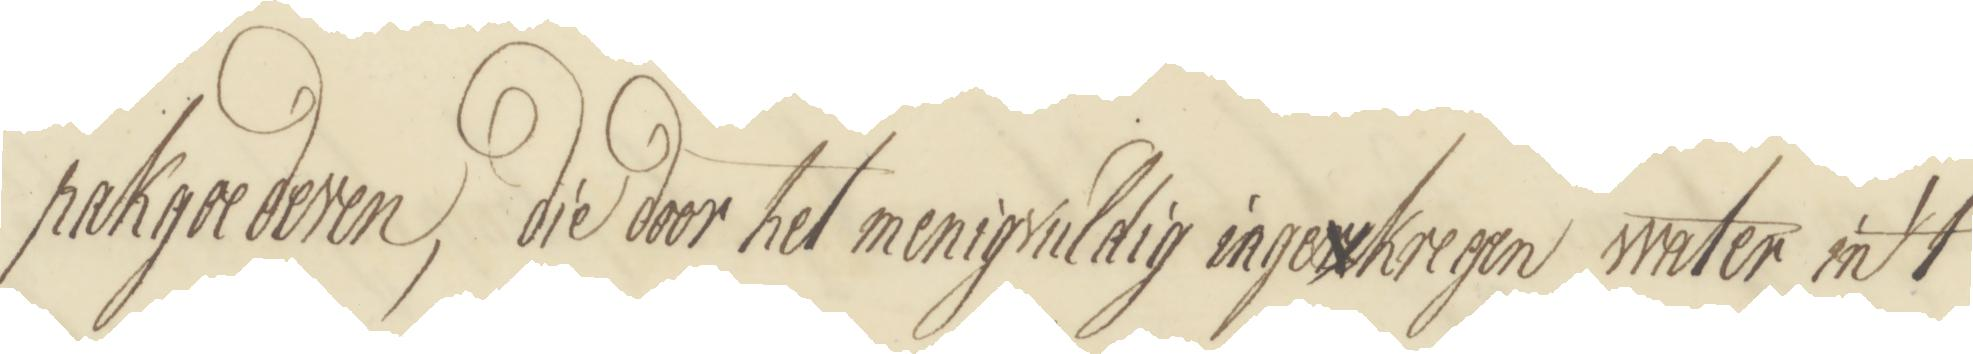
pakgoederen, die door het menigvuldig ingerkregen water in ’t
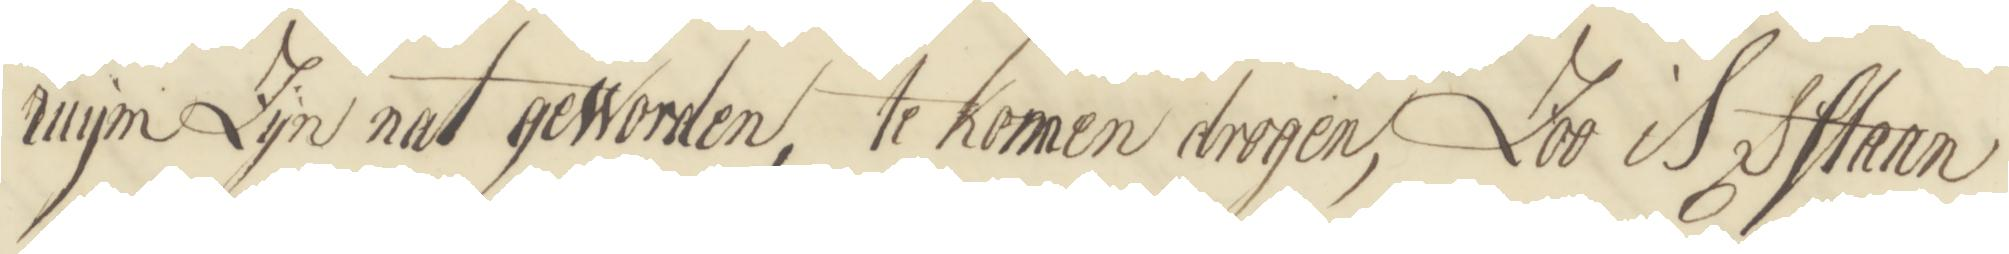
ruijm zijn nat geworden, te komen drogen, zoo is verstaan
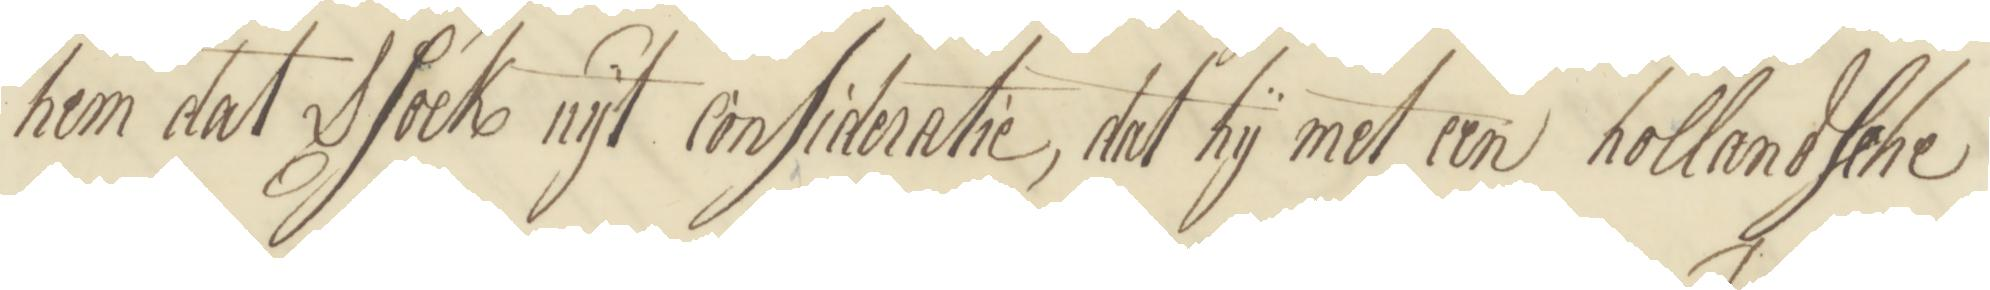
hem dat versoek uijt consideratie, dat hij met een hollandsche
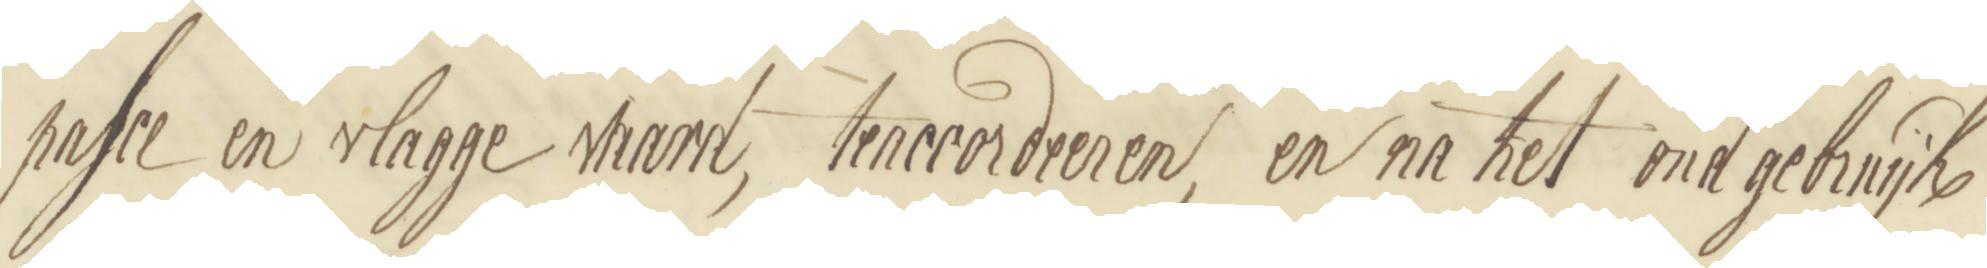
pasce en vlagge vaard, teaccordeeren, en na het oud gebruijk
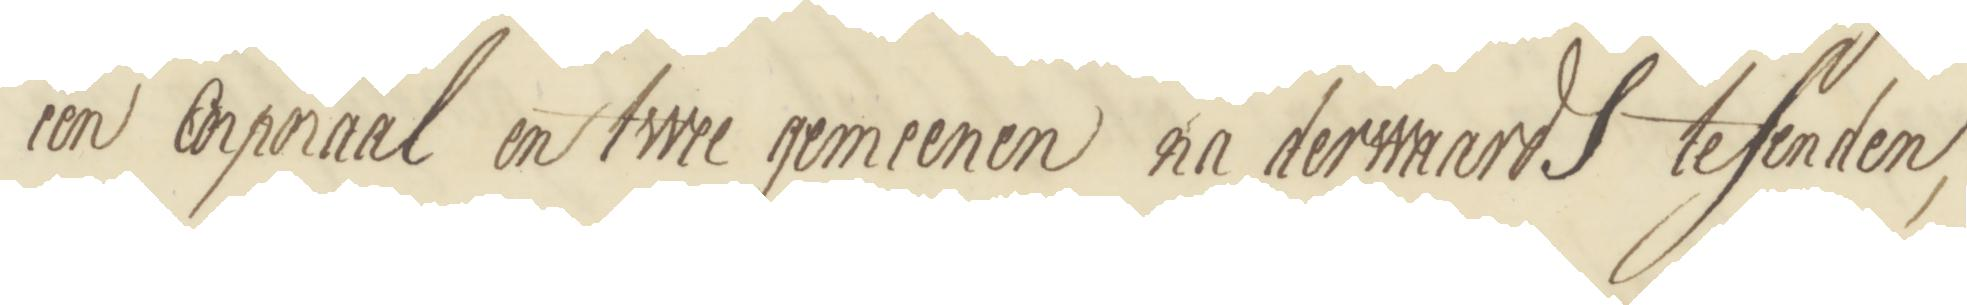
een Corporaal en twee gemeenen na derwaards tesenden,
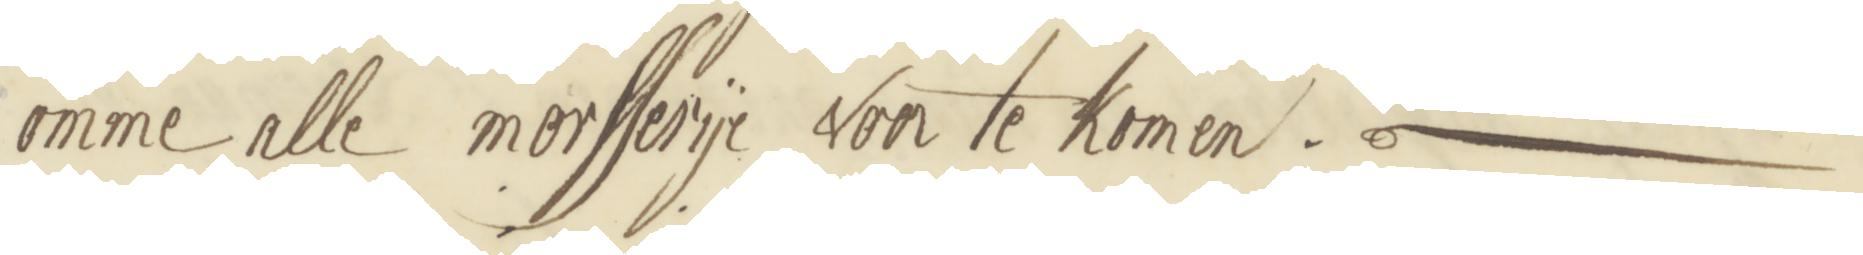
omme alle morsserije voor te komen. —
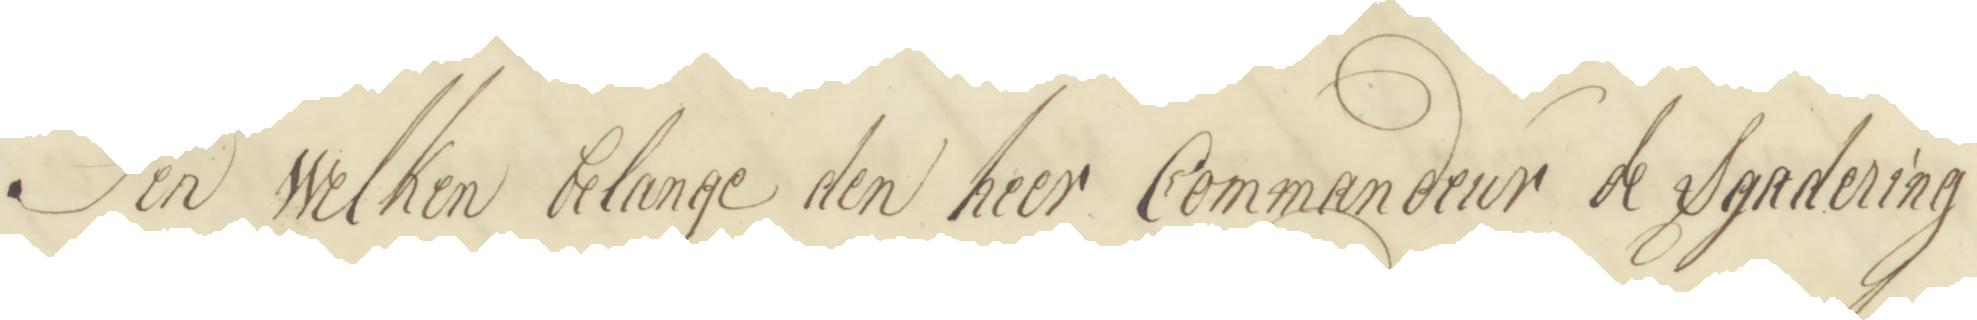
Ten welken belange den heer Commandeur de vergadering
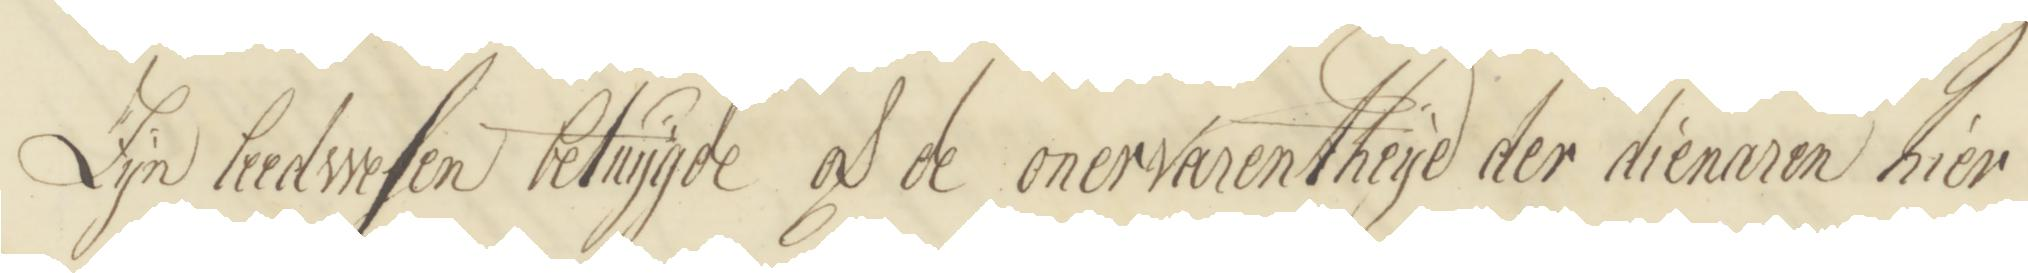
zijn leedwesen betuijgde over de onervarentheijd der dienaren hier
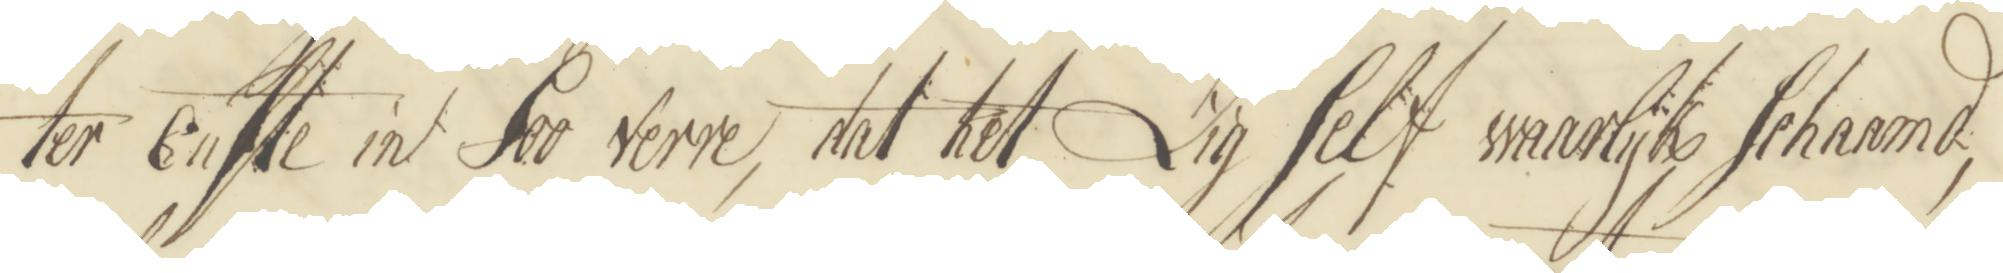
ter custe in soo verre, dat het zig self waarlijk schaamd,
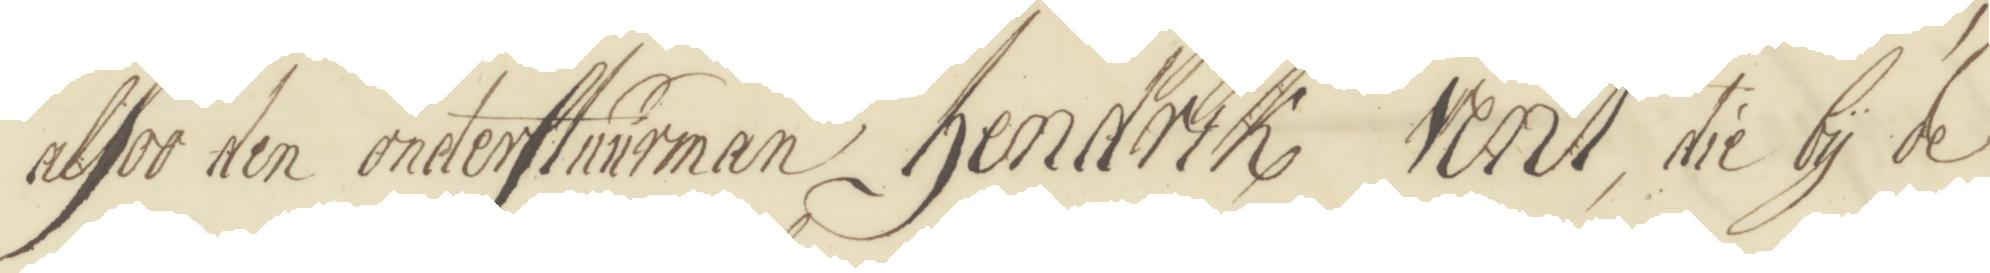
alsoo den onderstuurman Hendrik Vent, die bij de
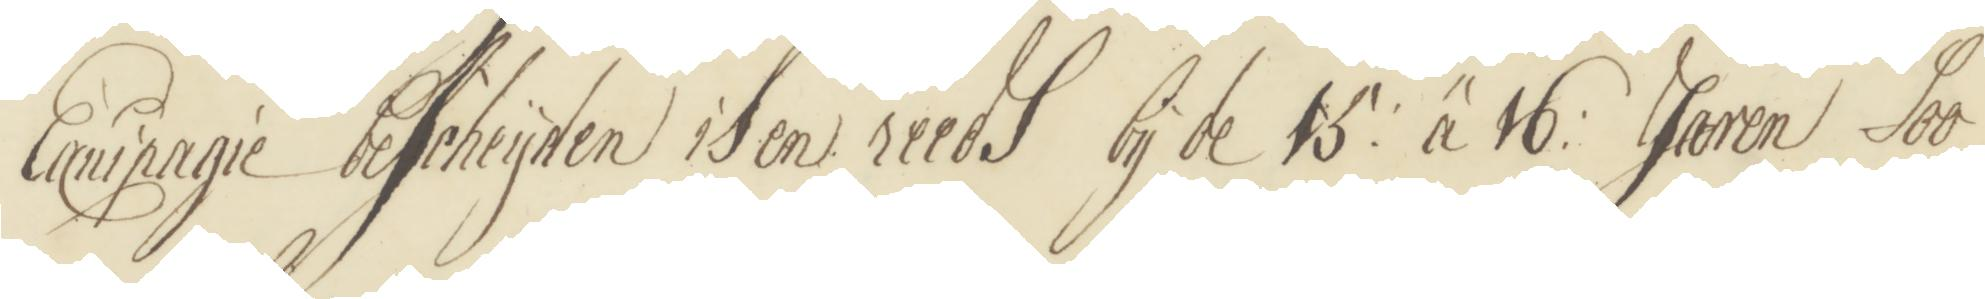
Equipagie bescheijden is en reeds bij de 15: â 16: Jaren soo
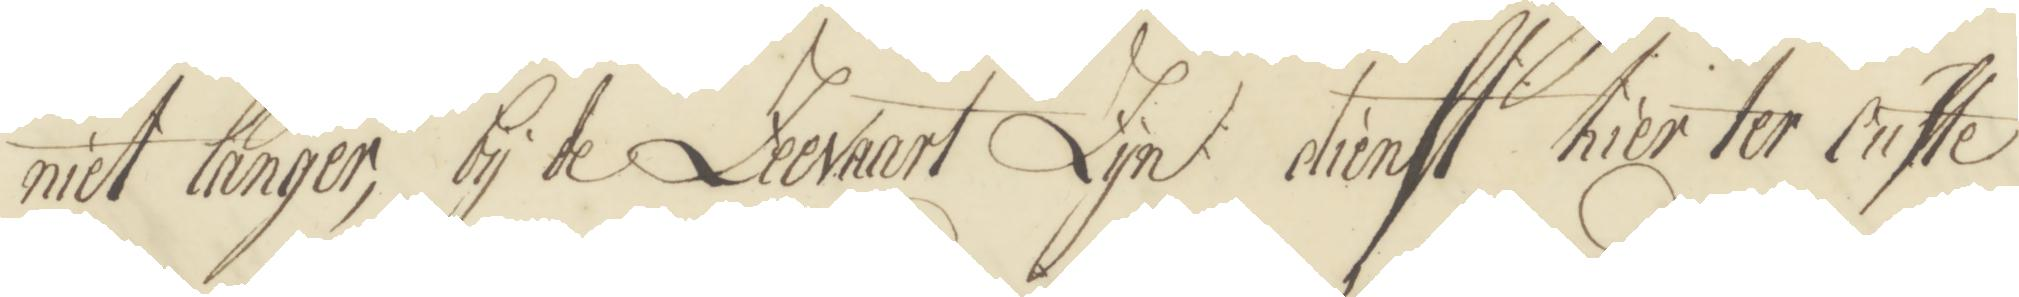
niet langer, bij de zeevaart zijn dienst hier ter custe
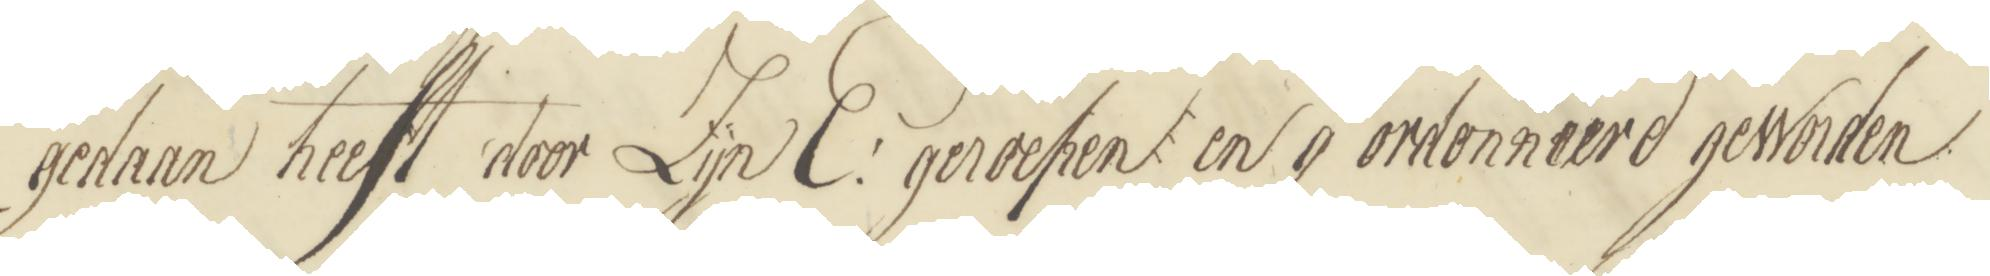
gedaan heeft door zijn E: geroepen en g’ordonneerd geworden
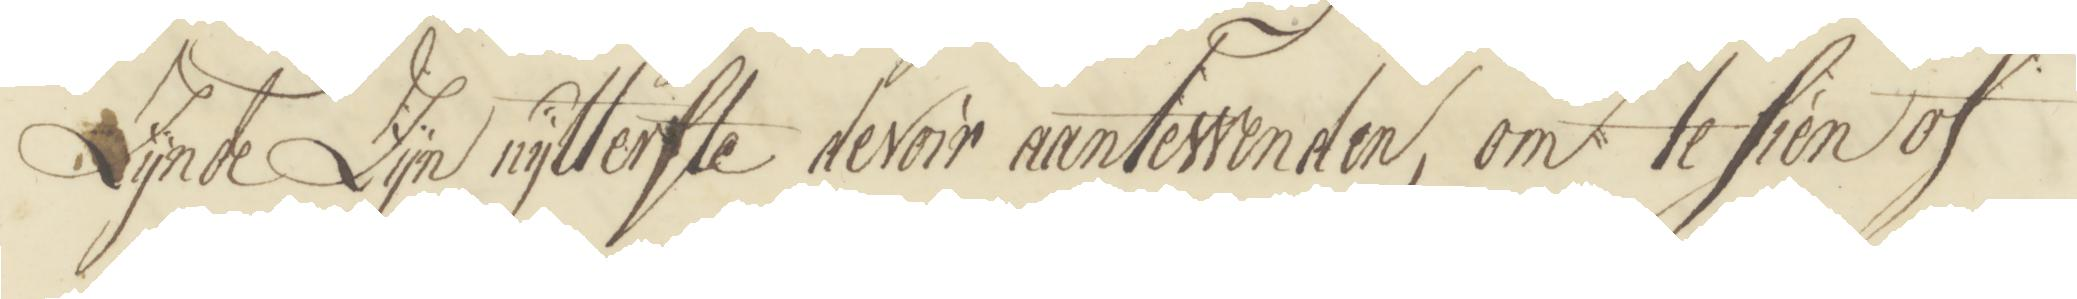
zijnde zijn uijtterste devoir aantewenden, om te sien of
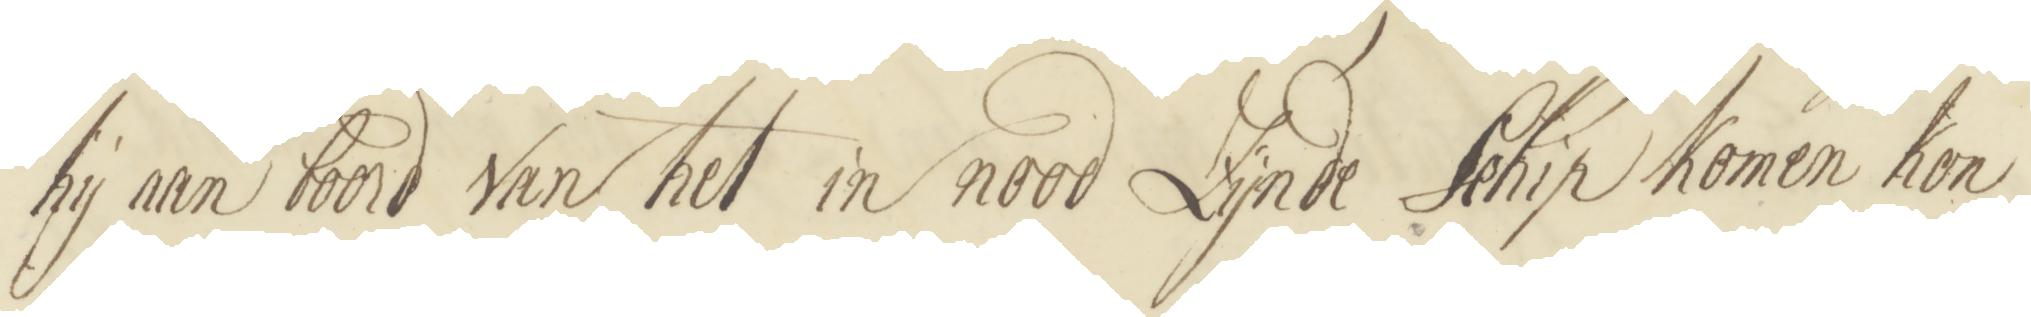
hij aan boord van het in nood zijnde schip komen kon
